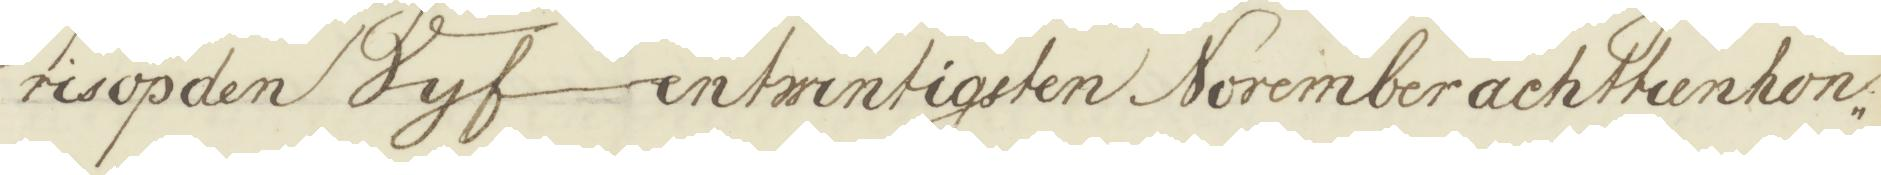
ris op den Vyf en twintigsten November achttienhon„
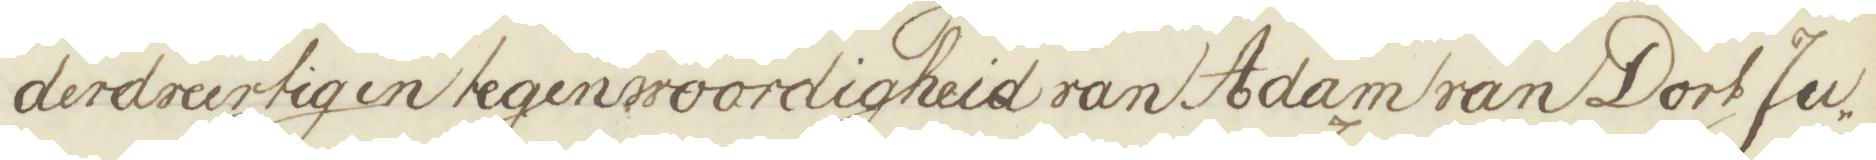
derd veertig in tegenwoordigheid van Adam van Dort Ju„
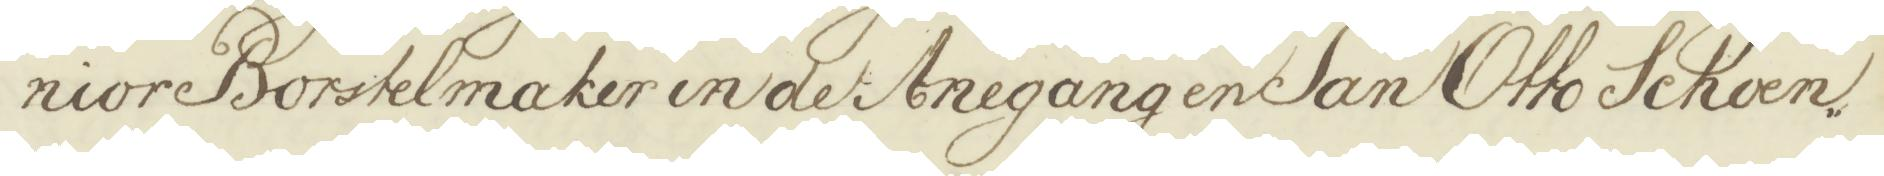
nior Borstelmaker in de Anegang en Jan Otto Schoen,
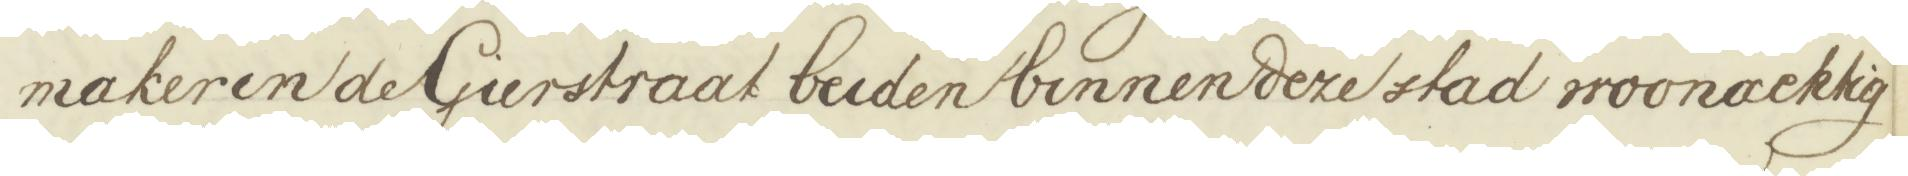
maker in de Gierstraat beiden binnen deze stad woonachtig
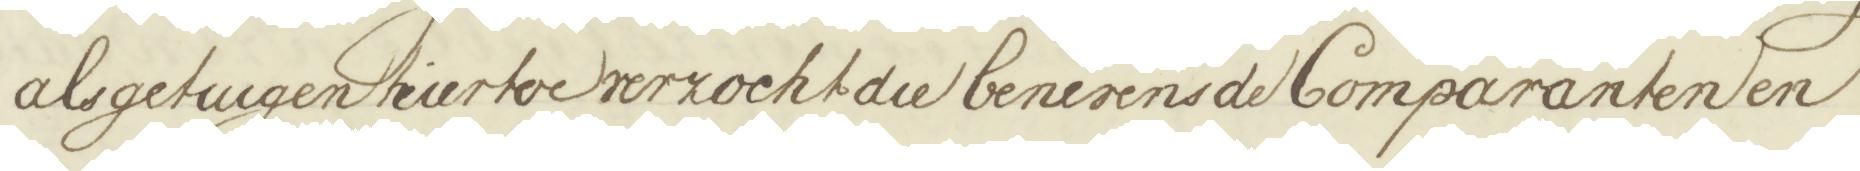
als getuigen hiertoe verzocht die benevens de Comparanten en
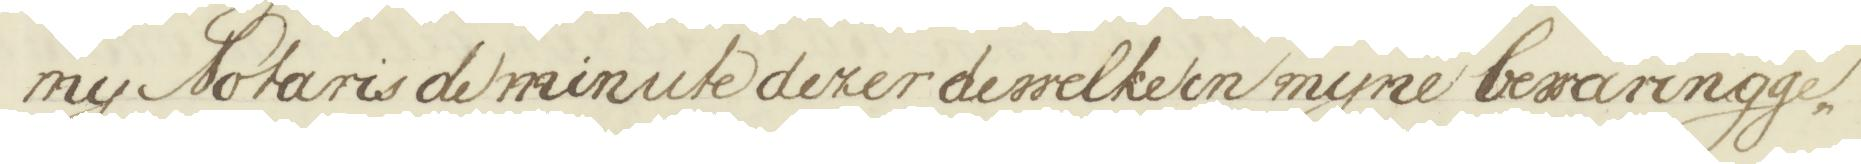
my Notaris de minute dezer dewelke in myne bewaring ge„
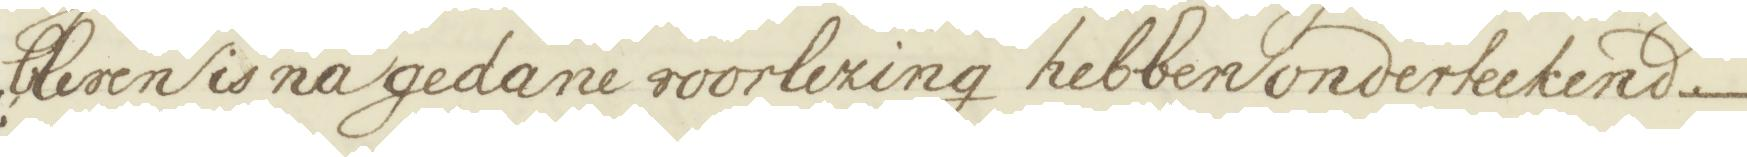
bleven is na gedane voorlezing hebben onderteekend
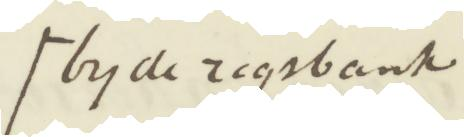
¶ bij de regtbank
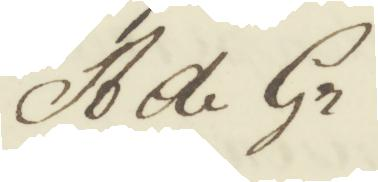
A de Gr
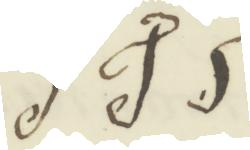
J J S
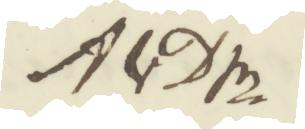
A V D j=r.
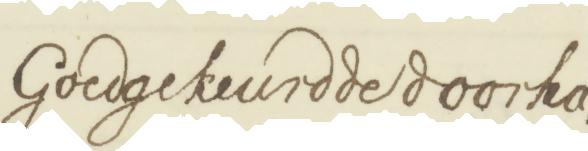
Goedgekeurd de doorha
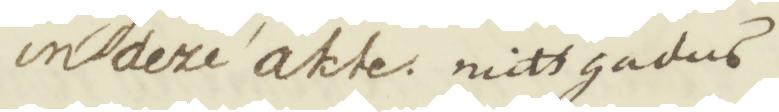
in deze akte, mitsgaders
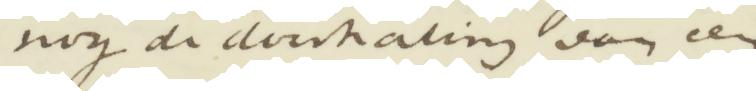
nog de doorhaling van een
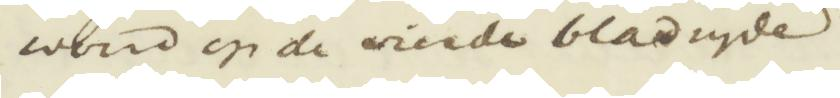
woord op de vierde bladzyde
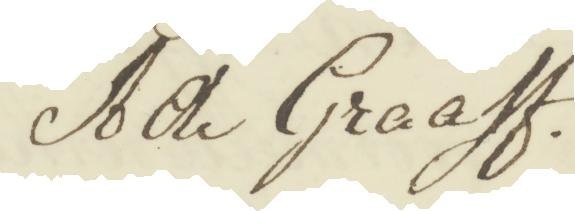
A de Graaff.
